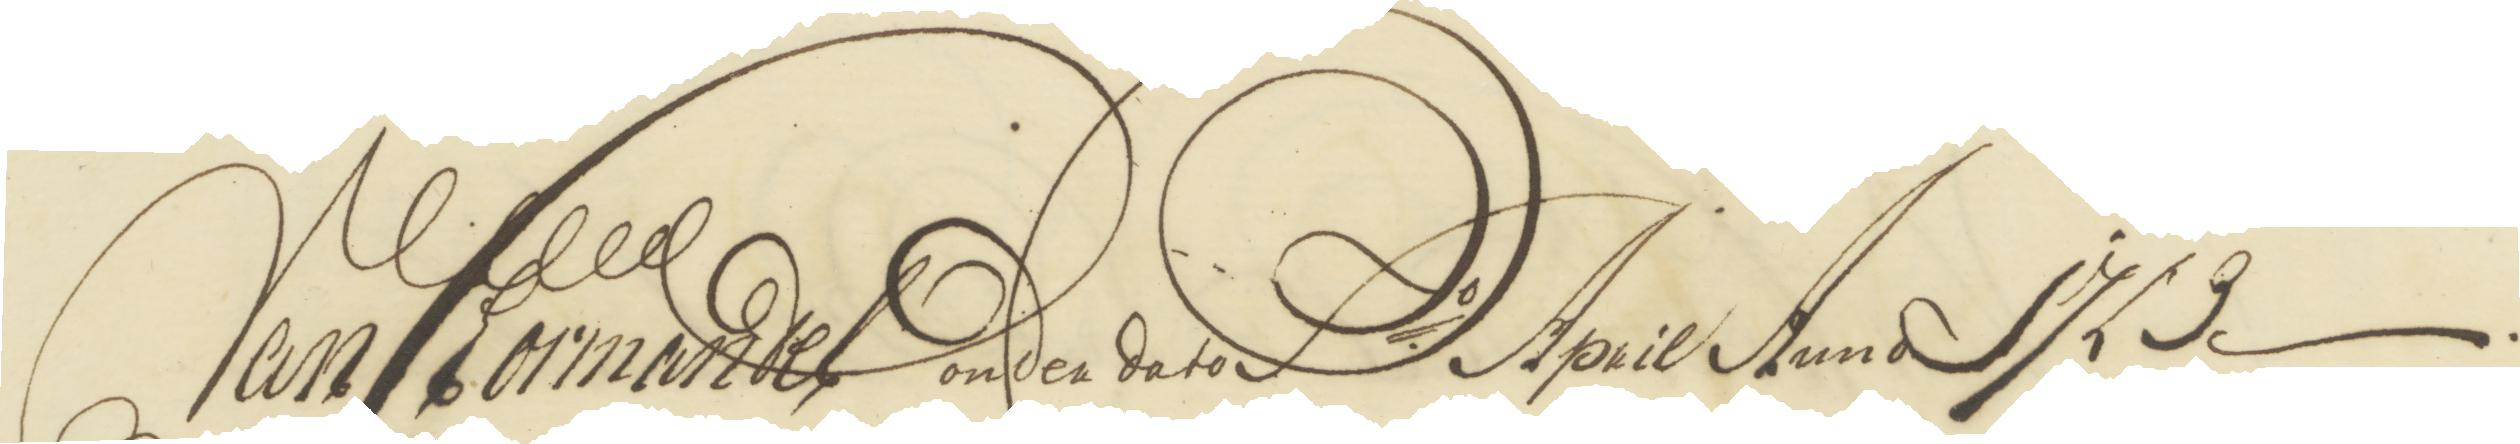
Van Chormandel onder dato P=o April Anno 1753 —.
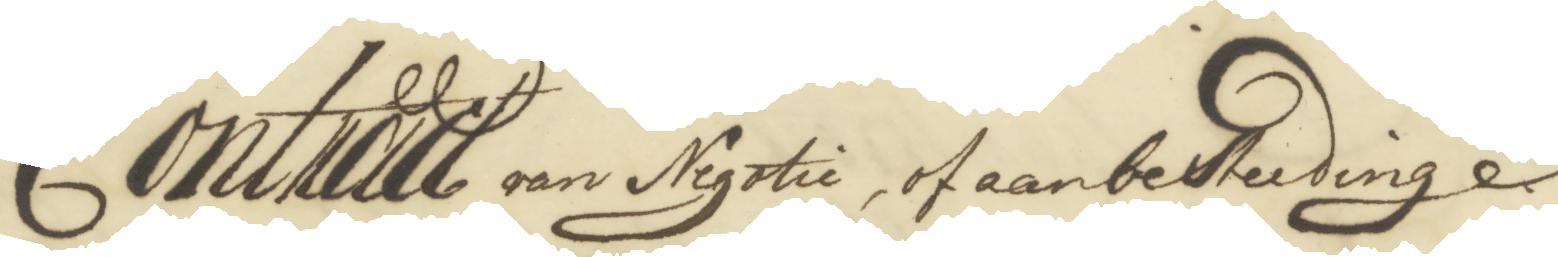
Contract van Negotie, of aanbesteedinge
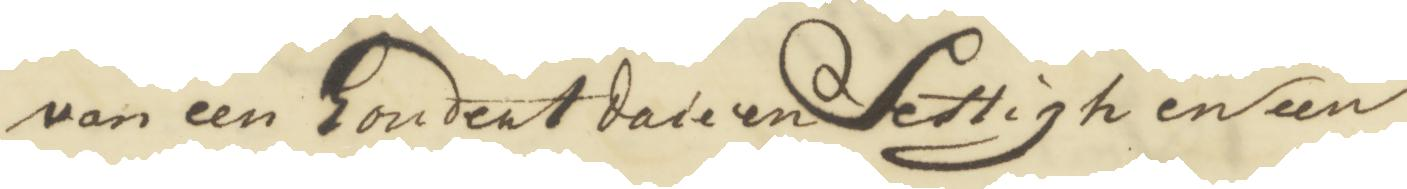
van een hondert drie en sestigh en een
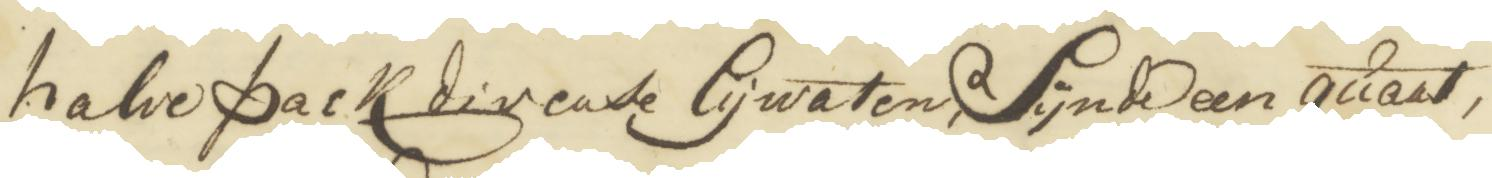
halve pack diverse lijwaten, sijnde een quart,
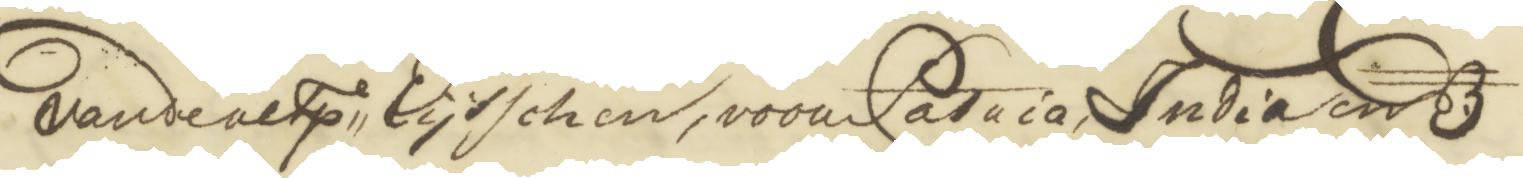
vanderetp„e Eijschen, voor Patria, Jndia ensz:
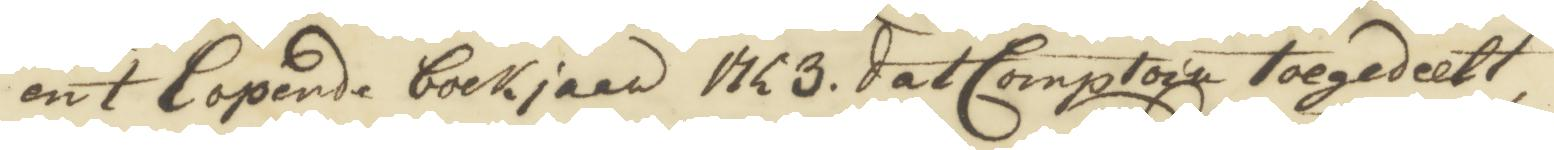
en ’t lopende boekjaar 1753. dat Comptoir toegedeelt,
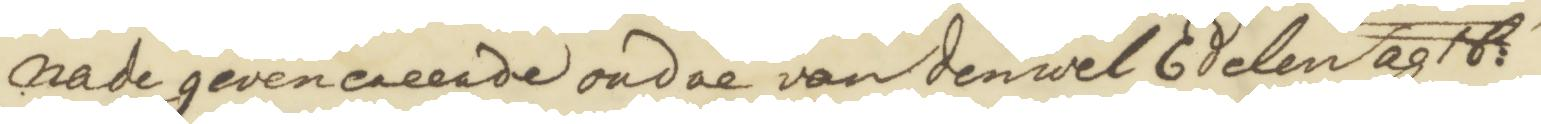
nade gevencreerde ordre van den wel Edelen agtb:
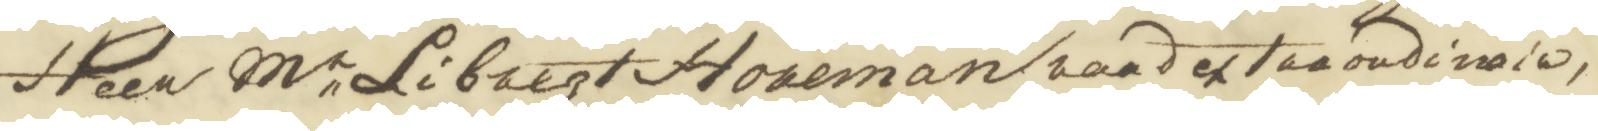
Heer M„r Libregt Horeman raad extra \ordinair,
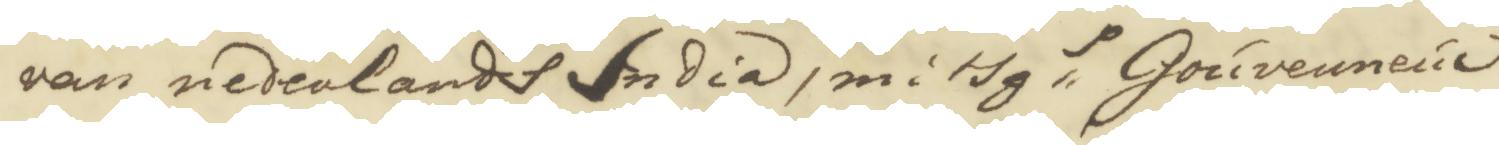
van nederlands Jndia, mitsg„s Gouverneur
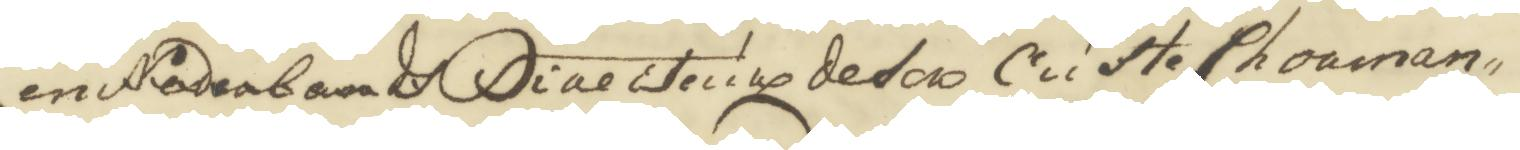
en Nederlands Directeur deser custe Chorman„
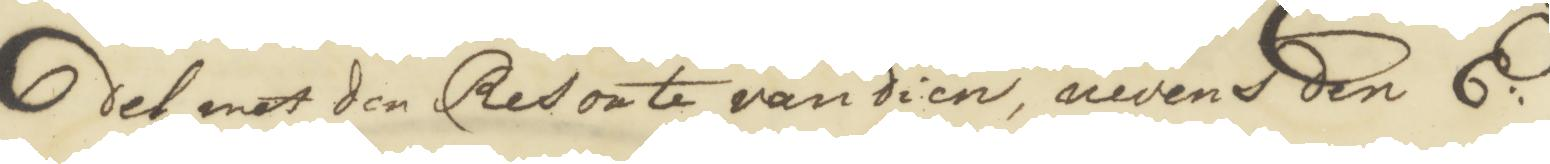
del met den Resorte van dien, nevens den E:
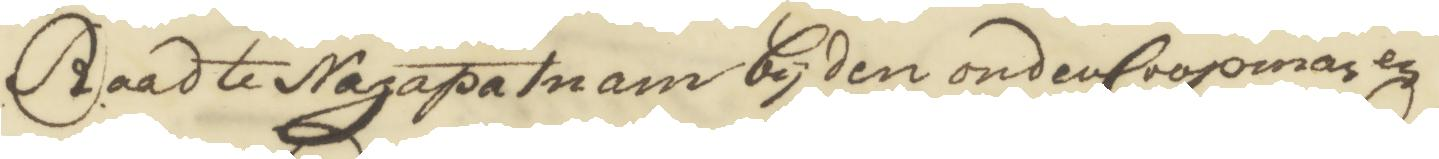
Raad te Nagapatnam bij den ondercoopman en
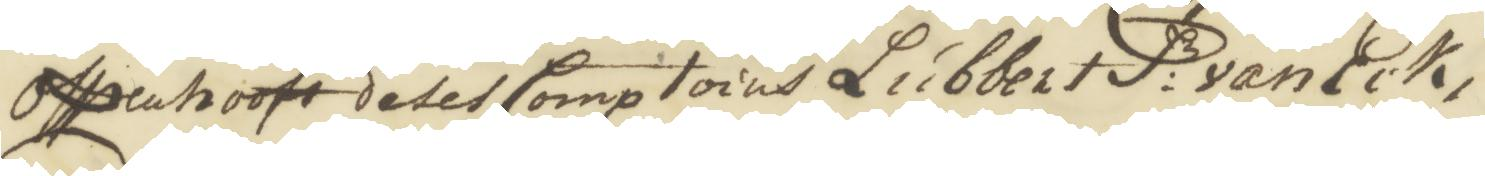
opperhooft deses Comptoirs Lubbert I:n van Eck,
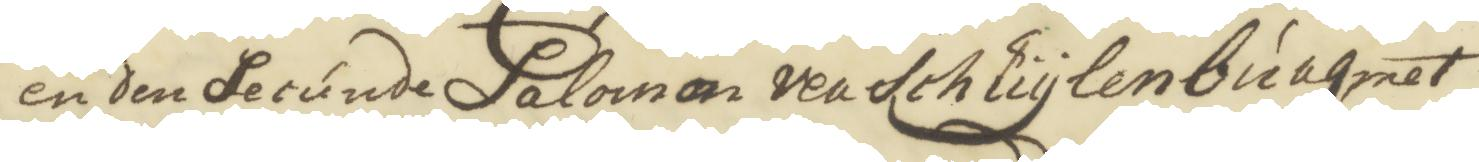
en den secunde Salomon verschuijlenburg met
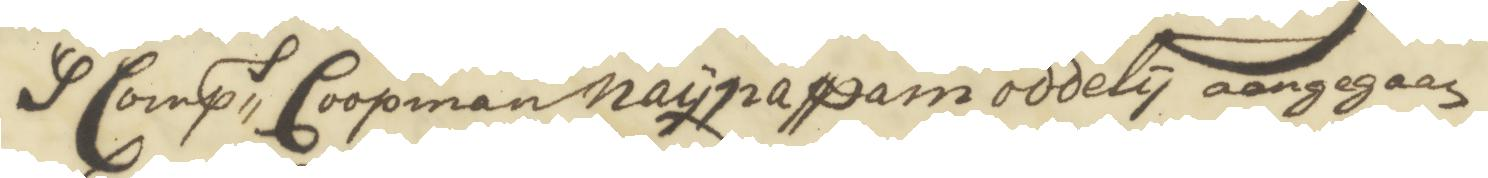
’s Comp„s Coopman naijpappam oddelij aangegaan
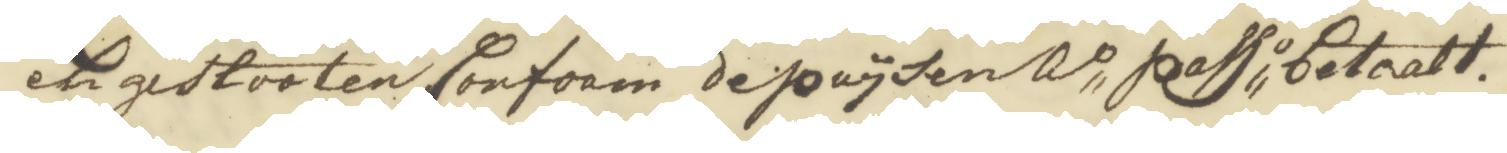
en geslooten, Conform deprijsen a„o pass„o betaalt.
